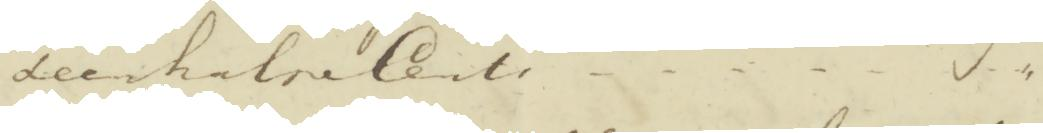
& een halve Cents „
